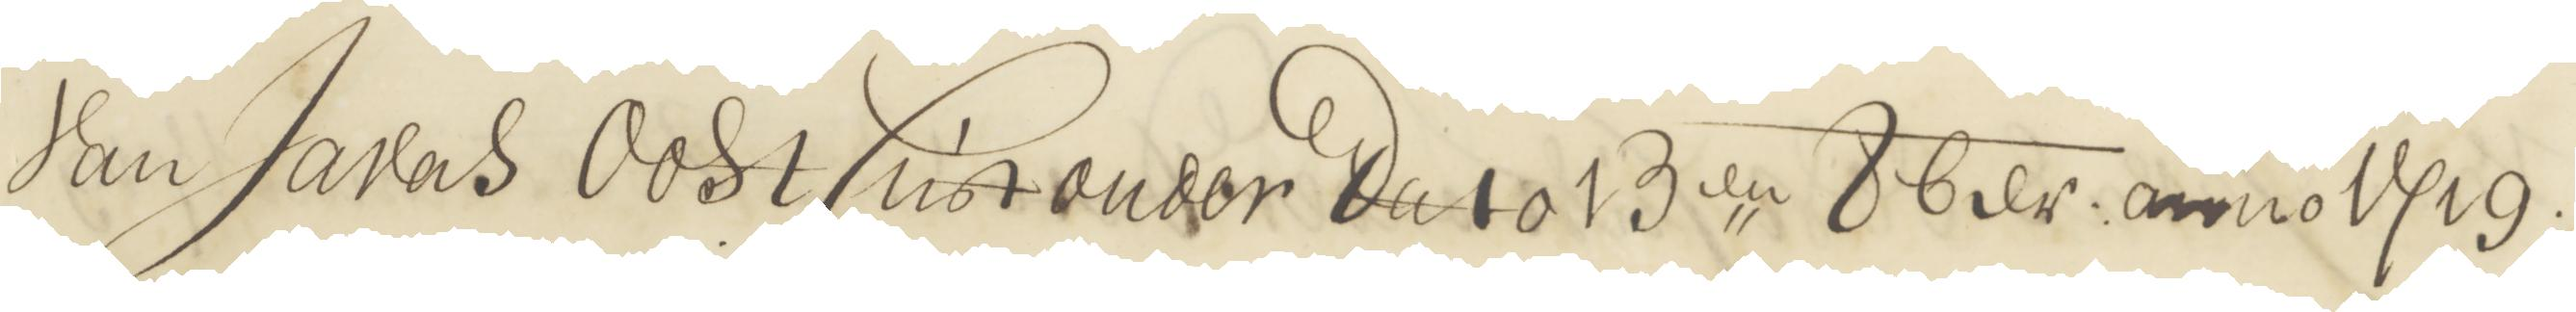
Van Javas Oost Cust onder dato 13„en 8ber: anno 1719.
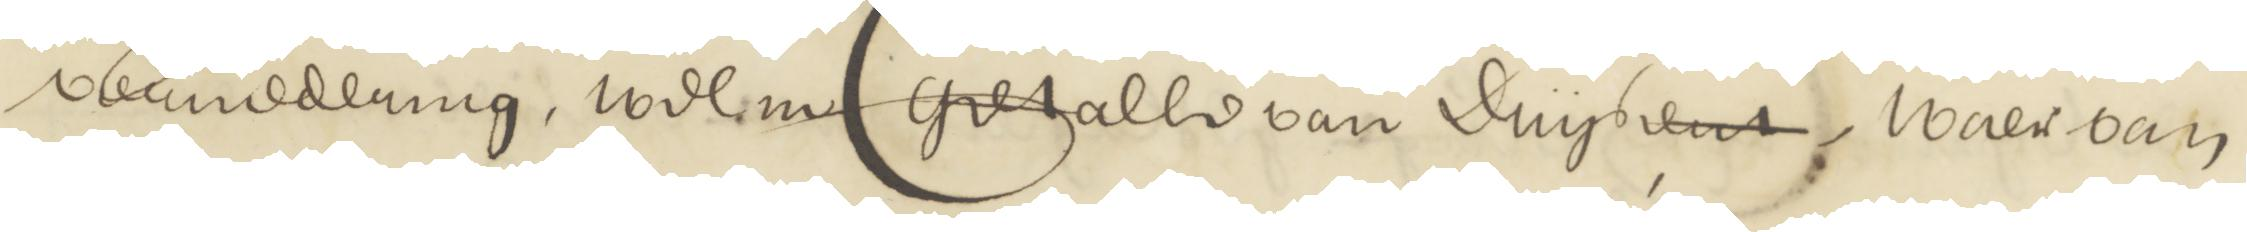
vernedering, wel in getalle van duijsent, waer van
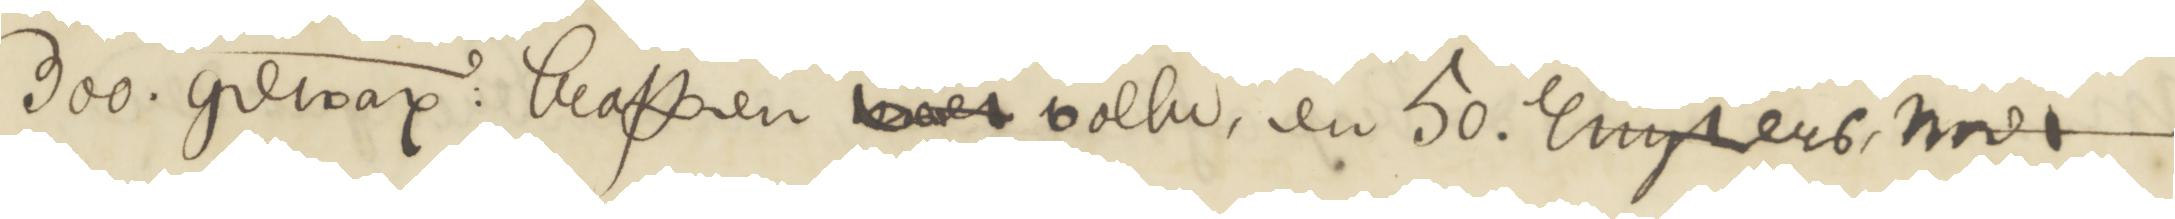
300. gewax:e koppen volt volk, en 50. ruijters, met
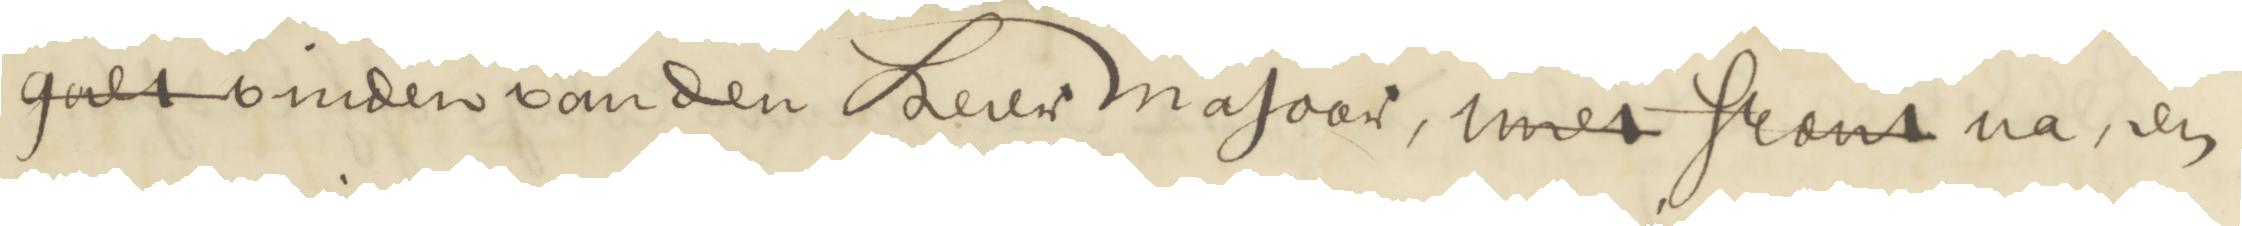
goet vinden van den Heer Majoor, met front na, en
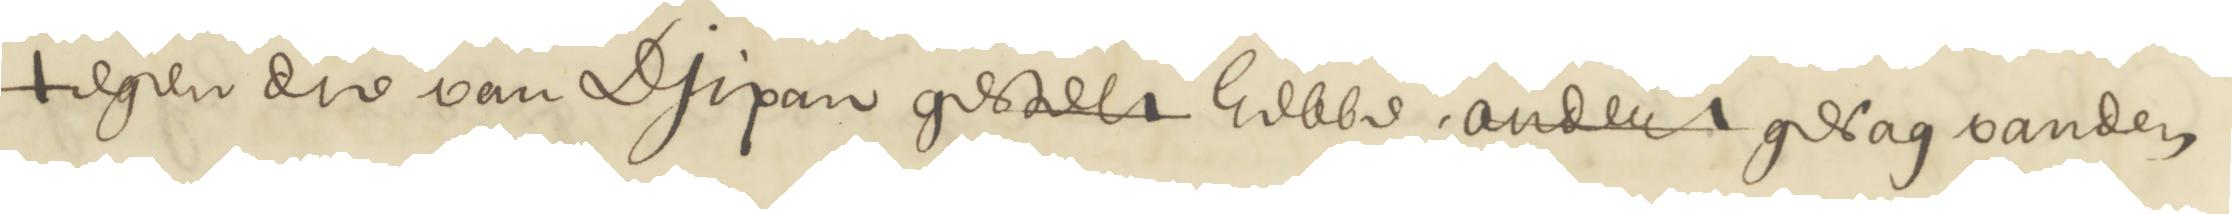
tegen die van Djipan gestelt hebbe, onder 't gesag vanden
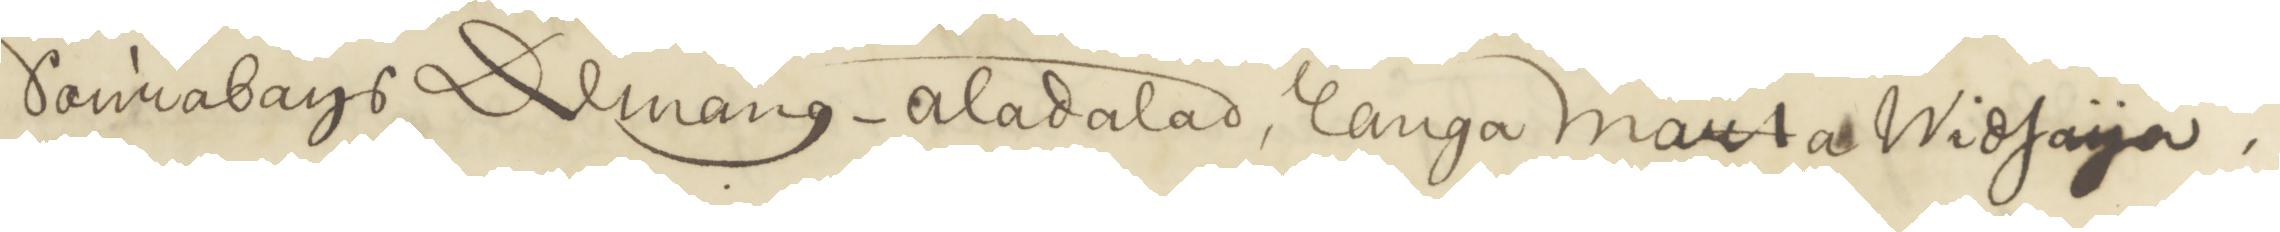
sourabaijs Demang - aladalad, ranga marta widjaija,
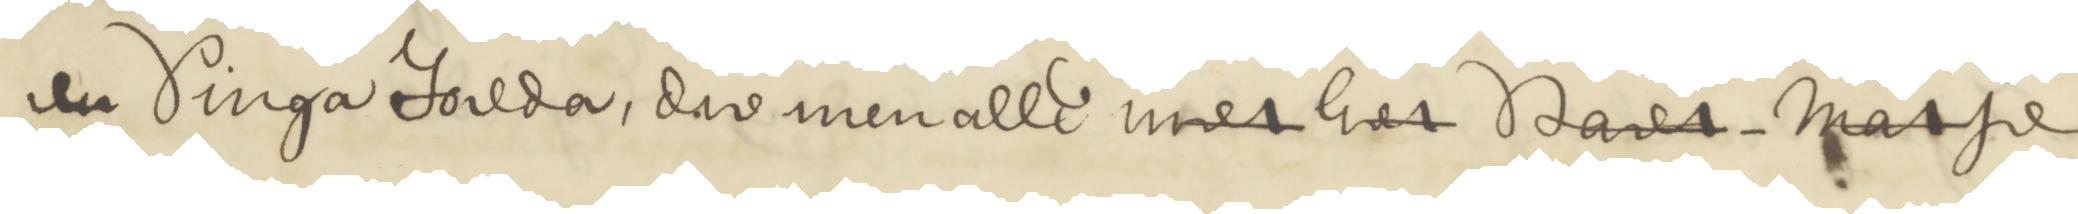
en singa Joeda, die men alle met het staet-matje
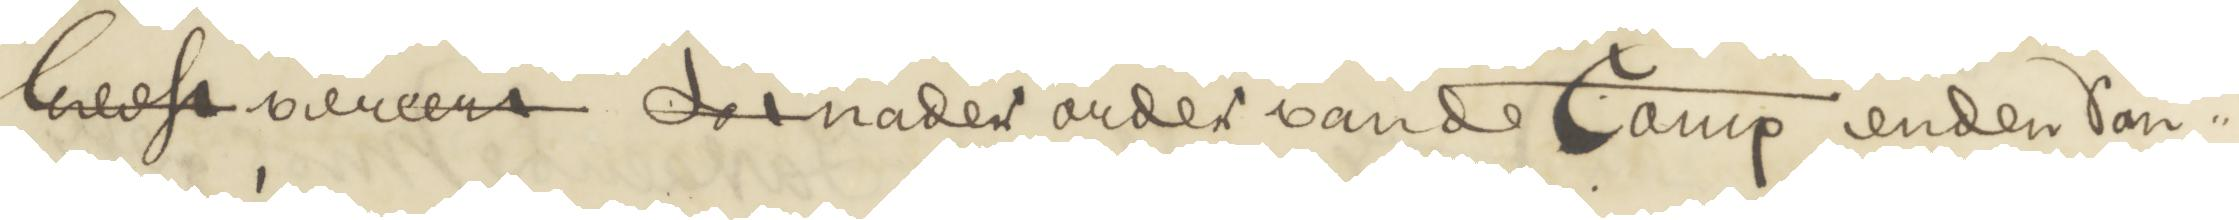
heeft vereert tot nader order van de Comp en den sou„
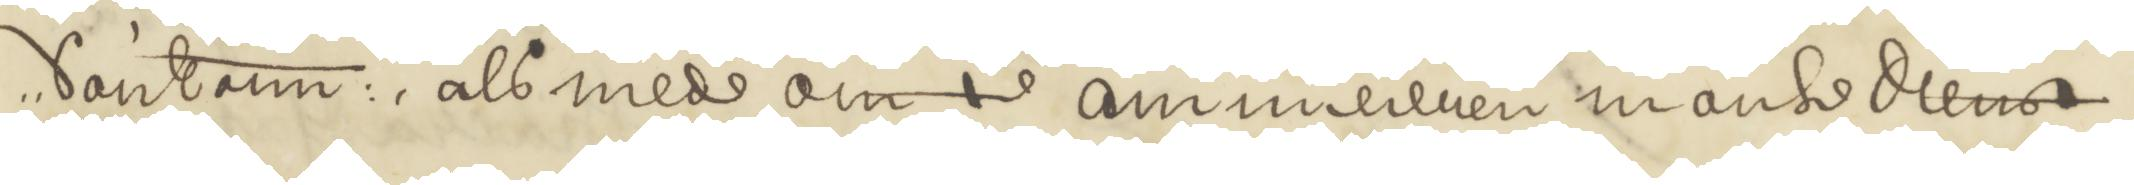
„souhoun:, als mede om te animeeren in onse dienst
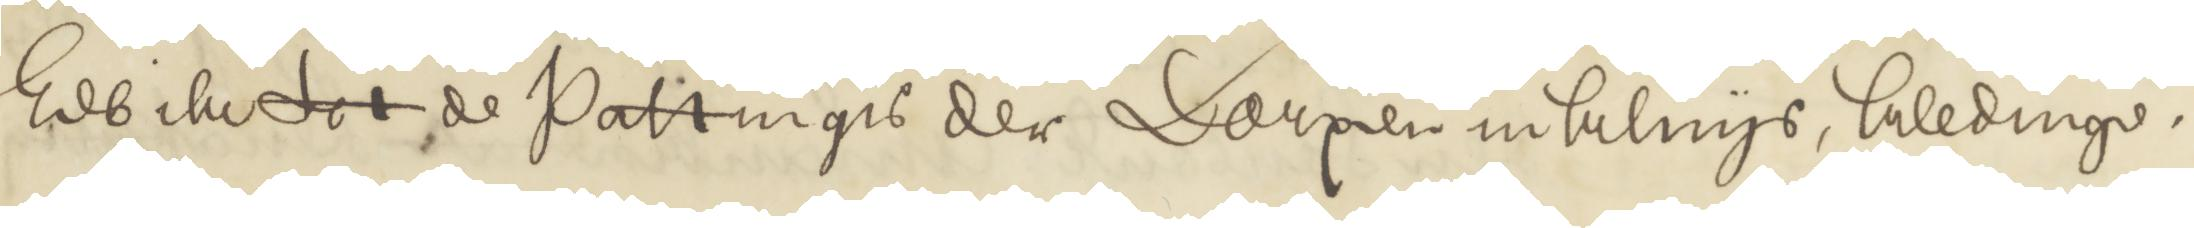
heb ik tot de Pattingis der Dorpen in kluijs, kledinge,
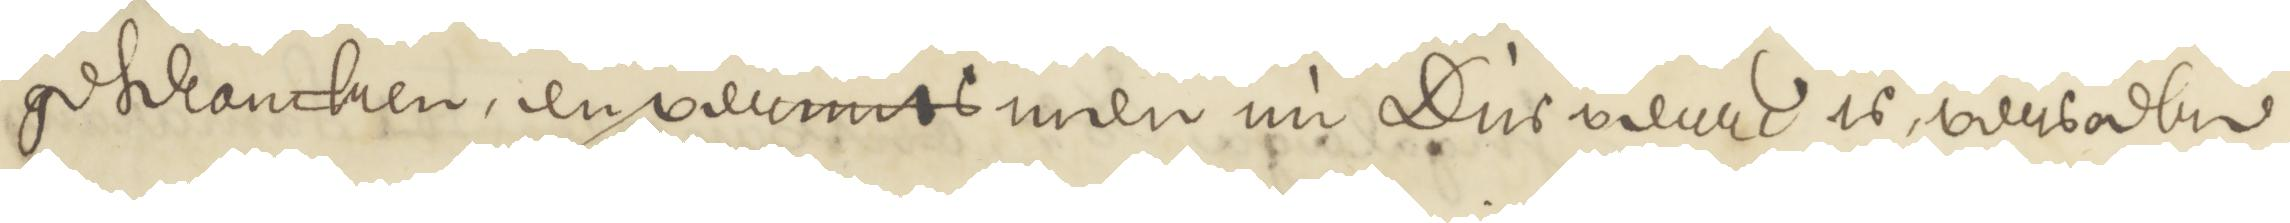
geschoncken, en vermits men nu Dusverre is, versoeke
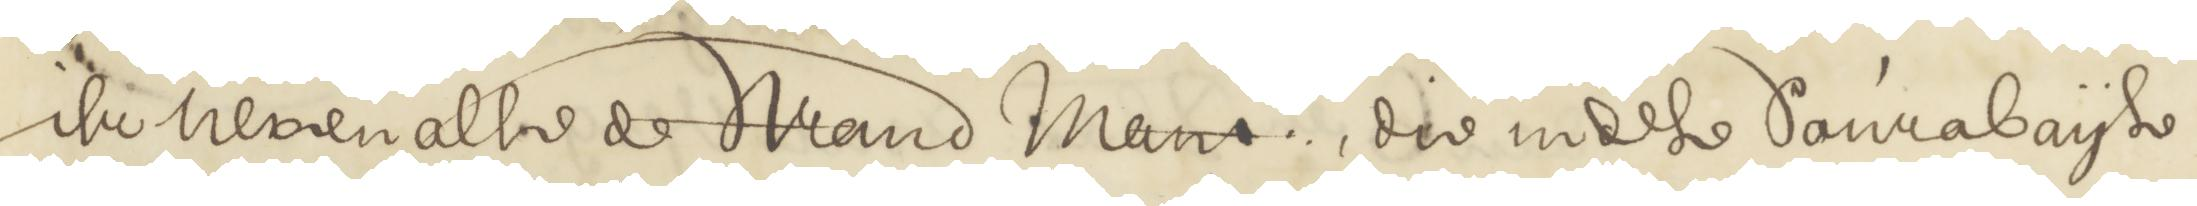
ik neven alle de strand mant:s, die in dese sourabaijse
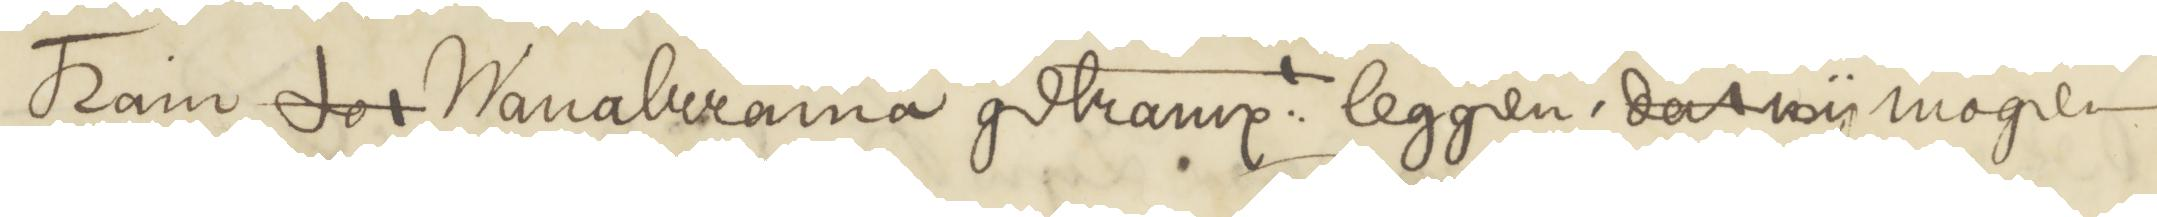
Train tot Wanakrama gekamp:t leggen, dat wij mogen
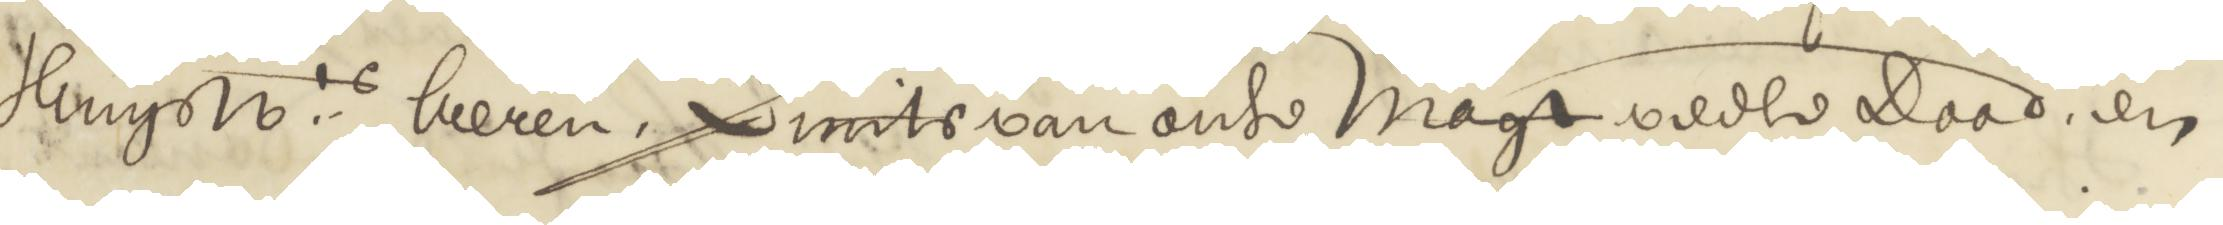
thuijsw:ts keren, vermits van onse magt veele Dood, en
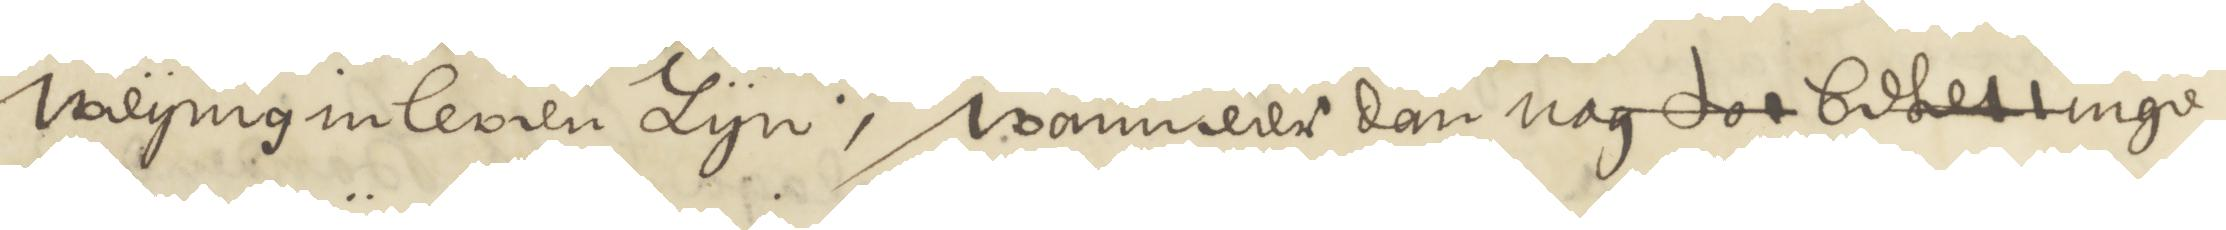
weijnig in leven zijn, wanneer dan nog tot besettinge
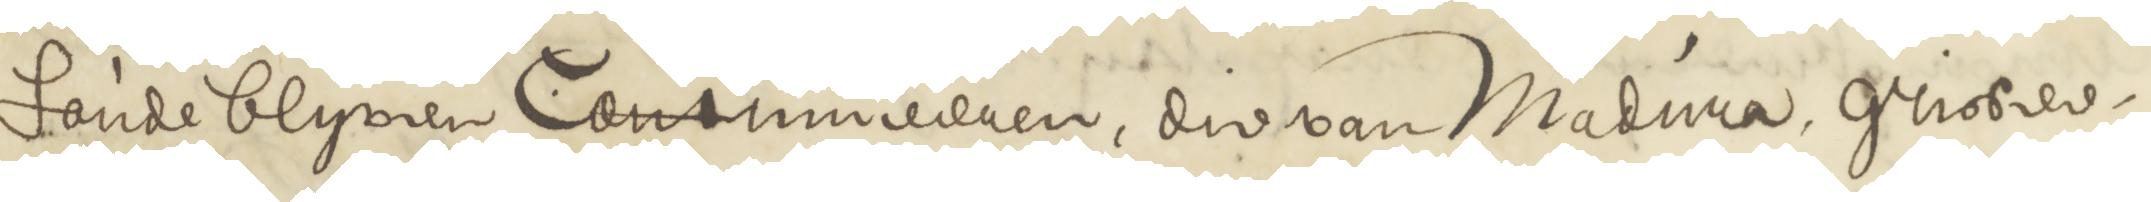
soude blijven Continueeren, die van Madura, grissee-
